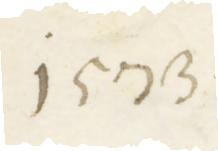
1573.
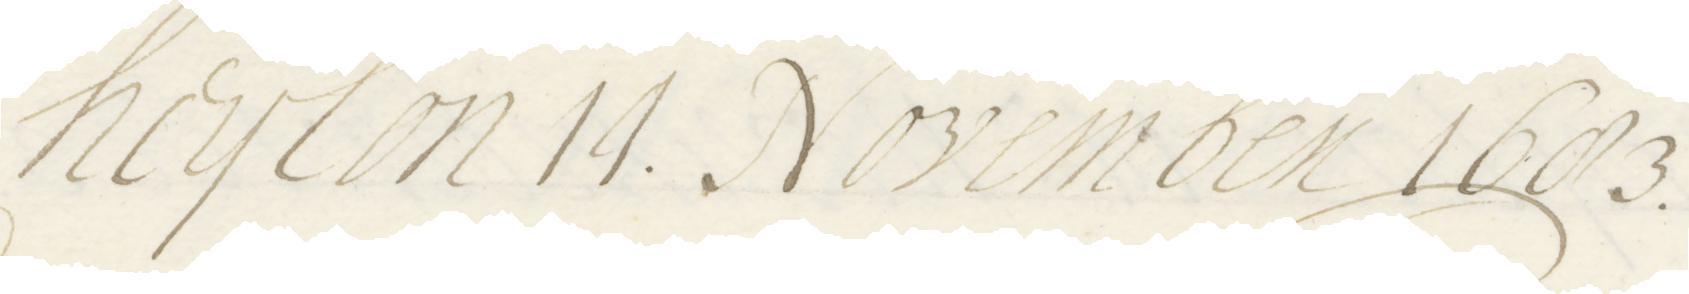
heijlon 14. November 1683.
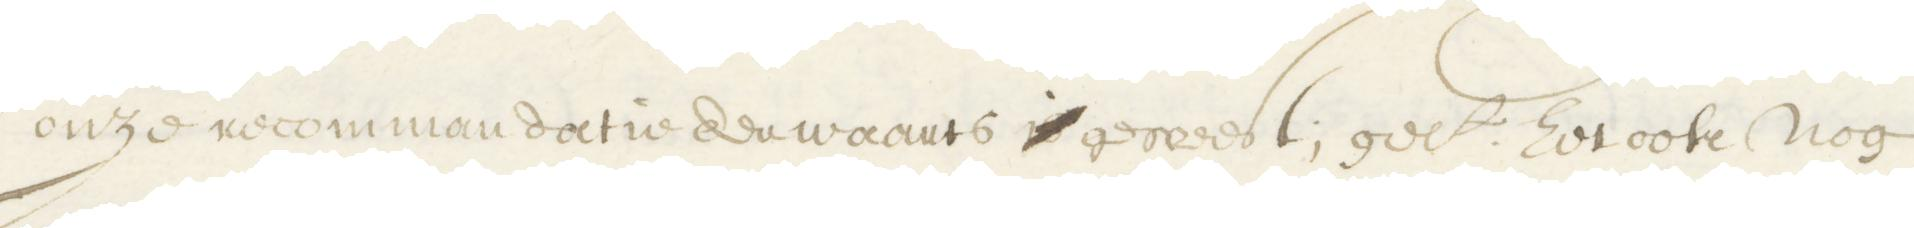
onze recommandatie derwaarts is geweest; gelijk het ook nog
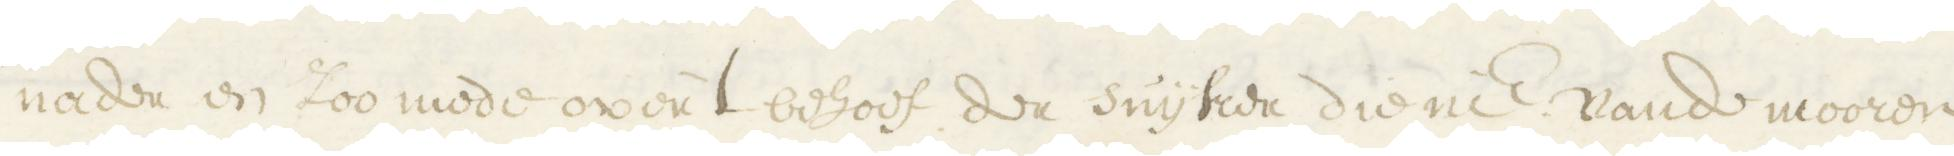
nader en Zoo mede over ’t behoef der suijker die uE: vande mooren
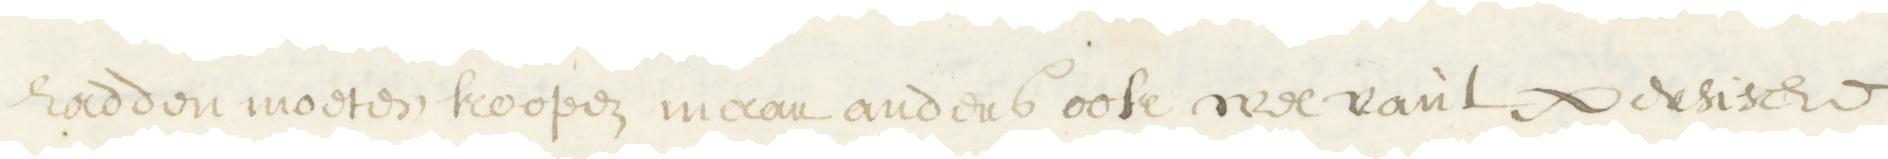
hadden moeten koopen maar anders ook wel van ’t Persische
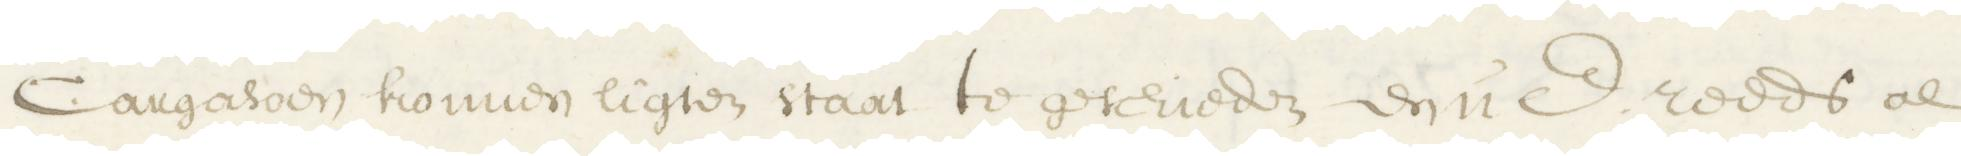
Cargasoen konnen ligten staat te geschieden en u E reeds al
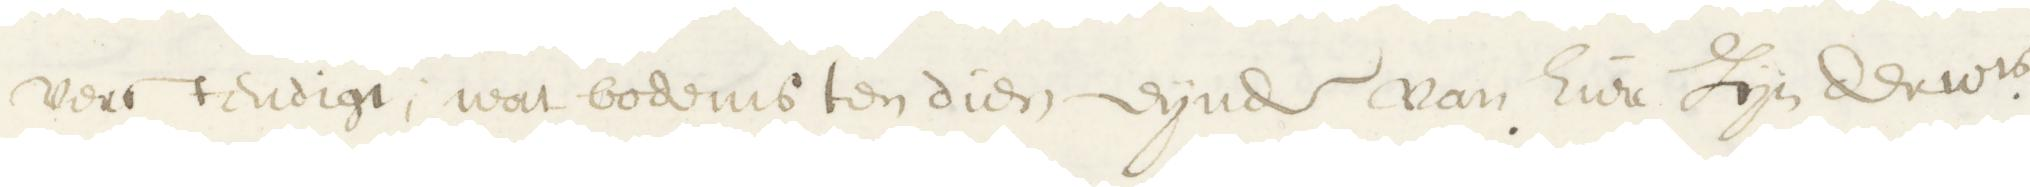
verstendigt, wat bodems ten dien eijnde van hier zij derw:ts
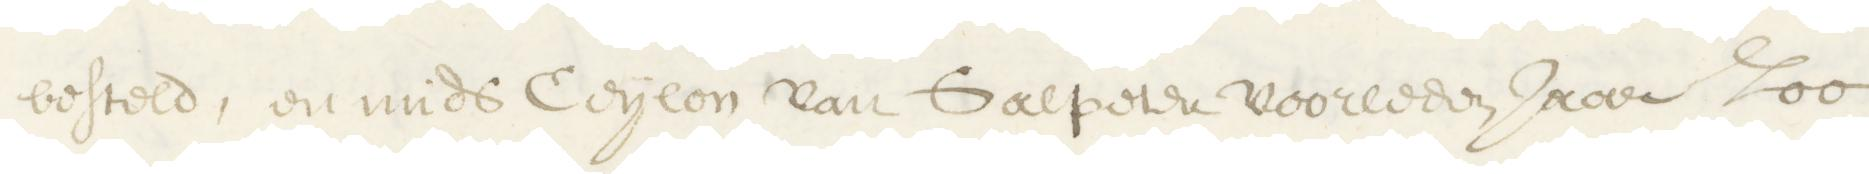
besteld, en mids Ceijlon van Salpeter voorleden Jaar Zoo
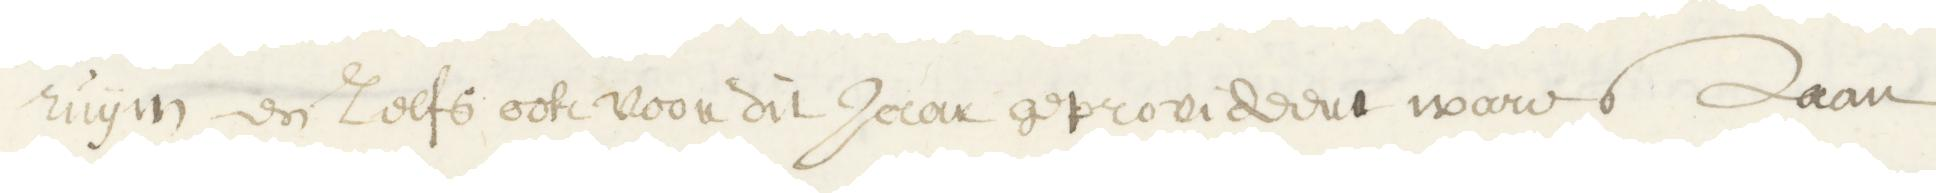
ruijm en Zelfs ook voor dit Jaar geprovideert ware staan
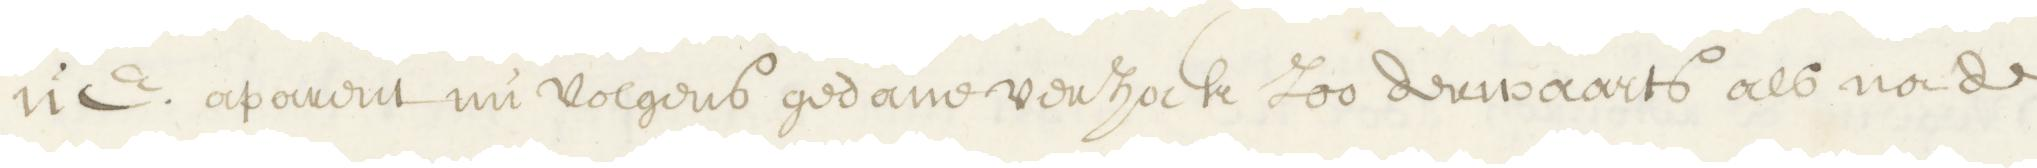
u E. aparent nu volgens gedane verzoek Zoo derwaarts als na de
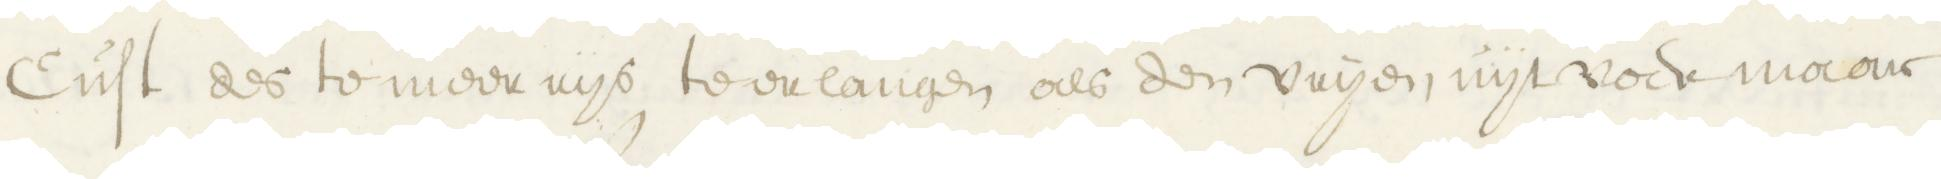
Cust des te meer rijs te erlangen als den vrijen uijtvoer maar
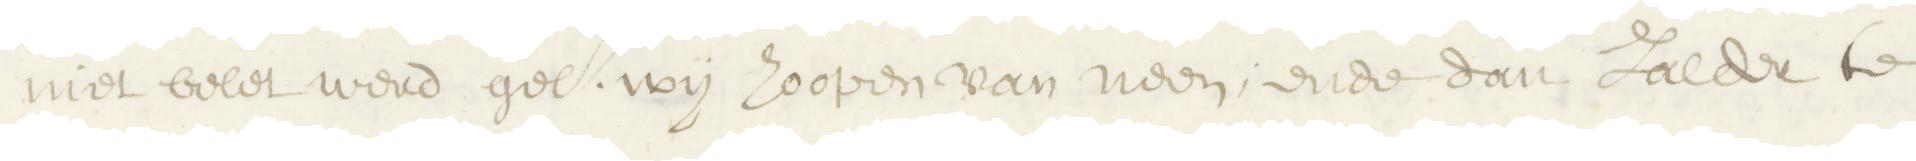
niet belet werd gelijk wij hoopen van neen; ende dan Zal der te
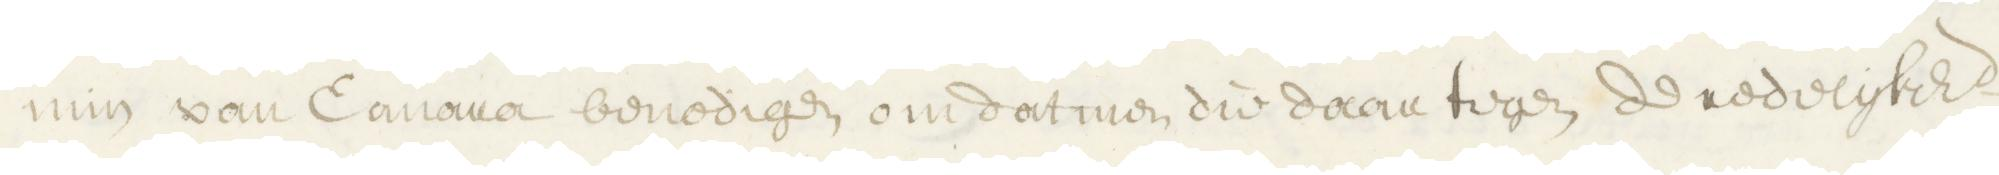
min van Canara benodigen omdat men die daar tegen de redelijkh:d
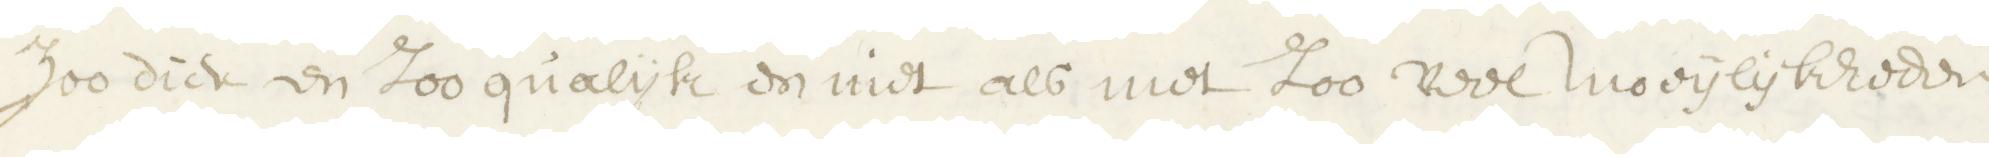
Zoo dier en Zoo qualijk en niet als met Zoo wel moeijlijkheden
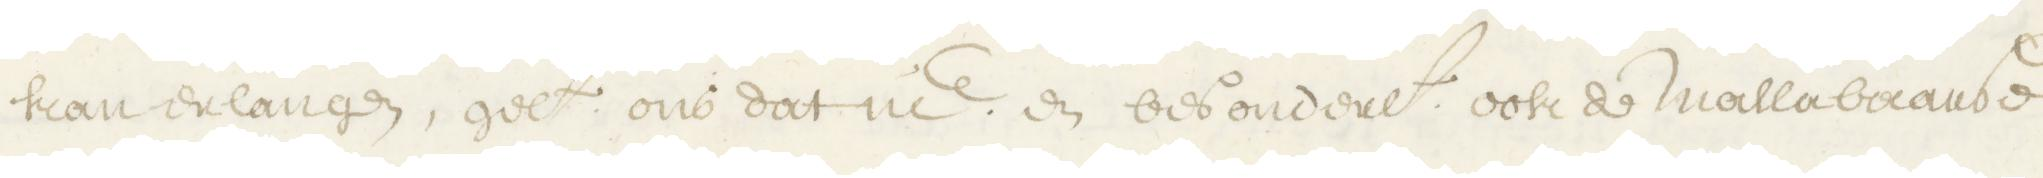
kan erlangen, gelijk ons dat u E. en besonderlijk ook de Mallabaarse
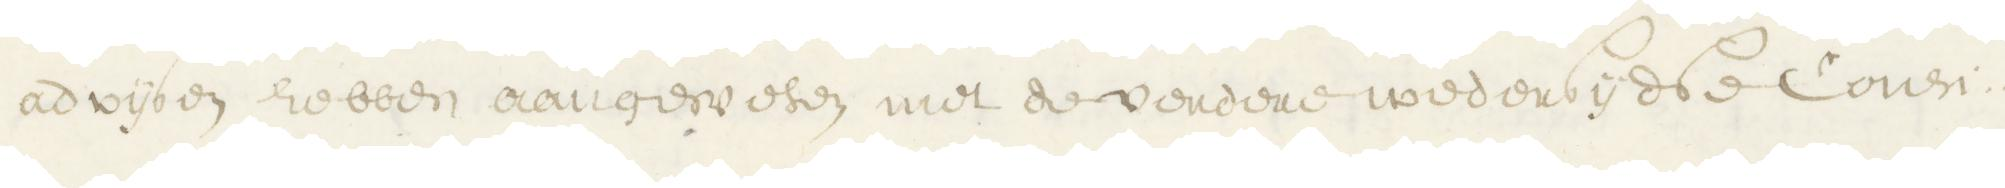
advijsen hebben aangewesen met de verdere wedersijdse Consi.
